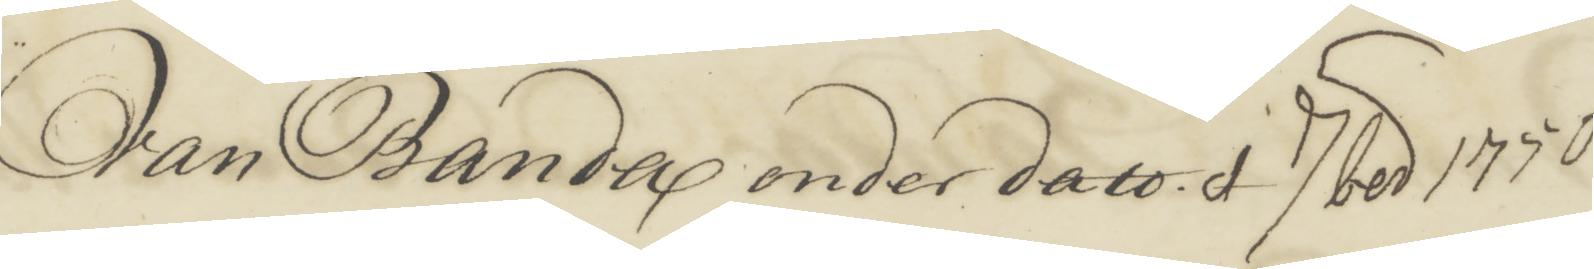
Van Banda onder dato. i 7ber 1750
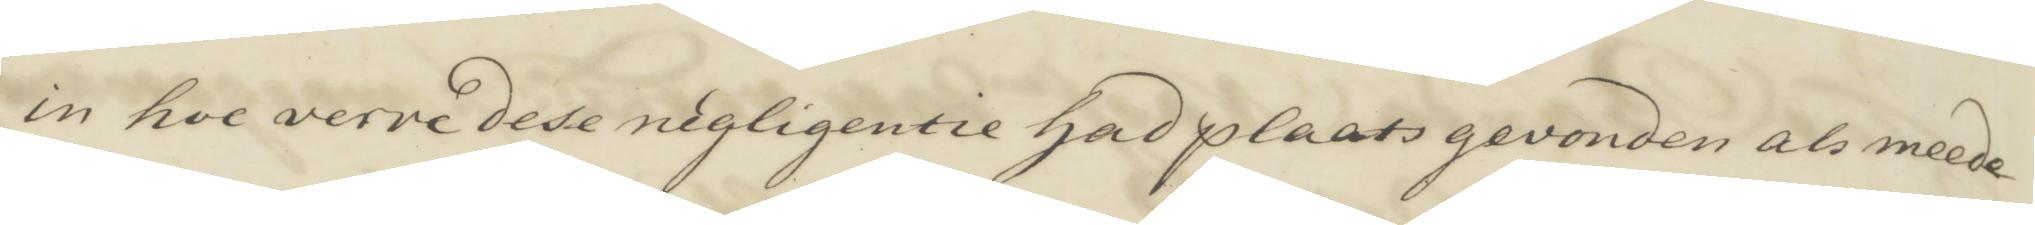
in hoe verre dese negligentie had plaats gevonden als meede
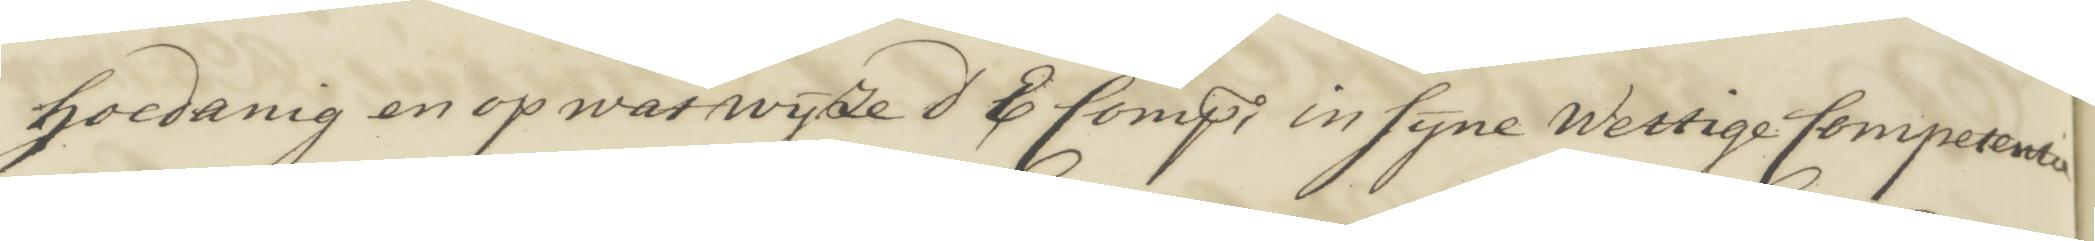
hoedanig en op wat wijze d' E Comp,' in sijne wettige Competentie
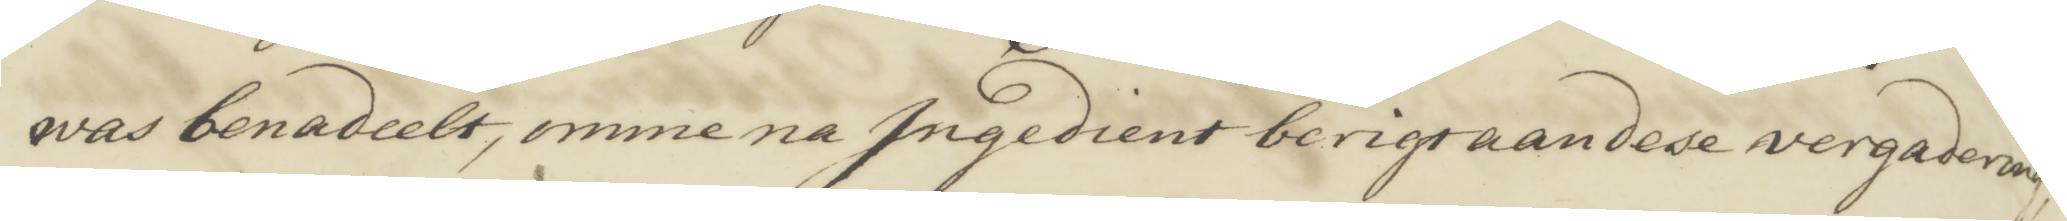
was benadeelt, omme na Jngedient berigt aan dese vergadering
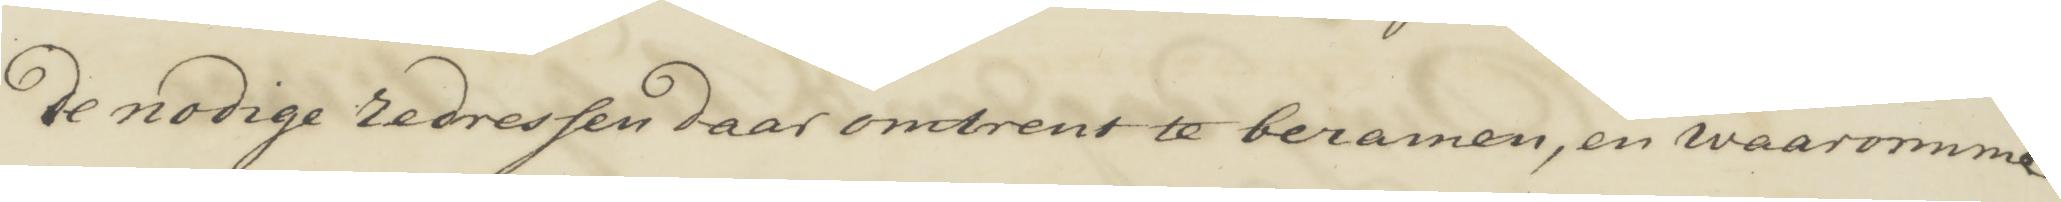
de nodige redressen daar omtrent te beramen, en waaromme
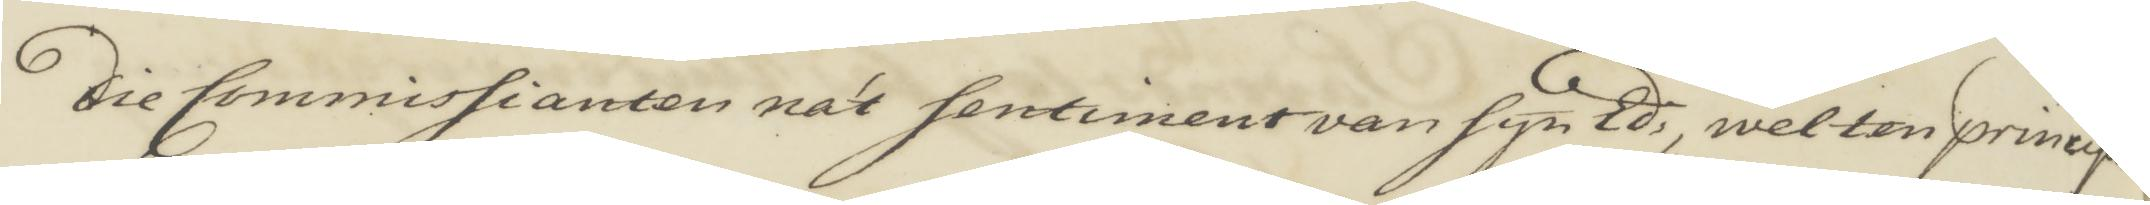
die Commissianten na’t sentiment van sijn Ed,, wel ten principale
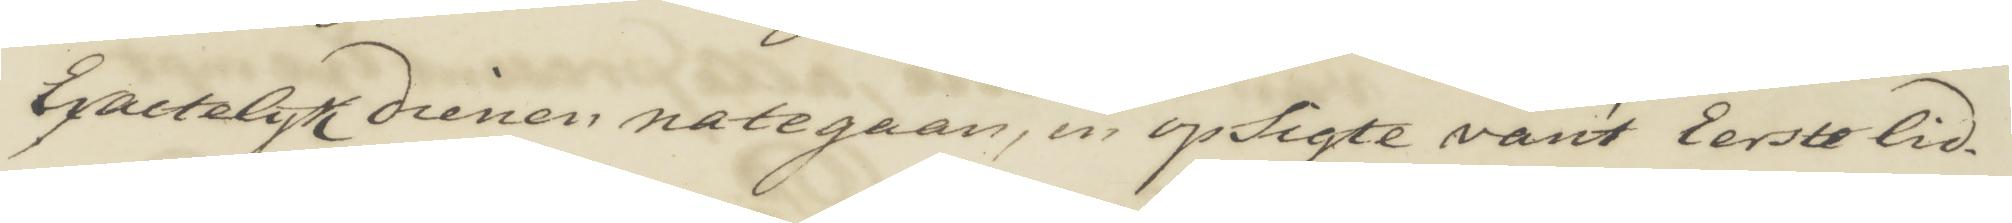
Exactelijk dienen nategaan, in opsigte van’t Eerste lid.
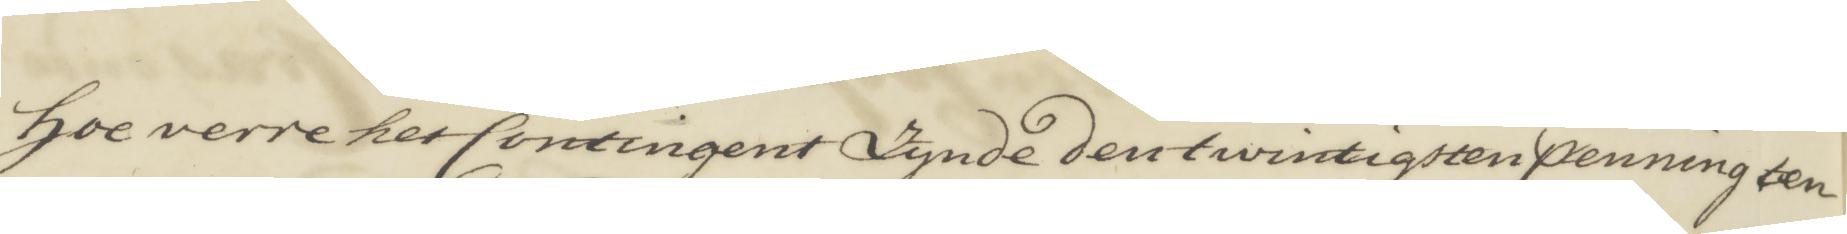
hoe verre het Contingent zijnde den twintigsten penning ten
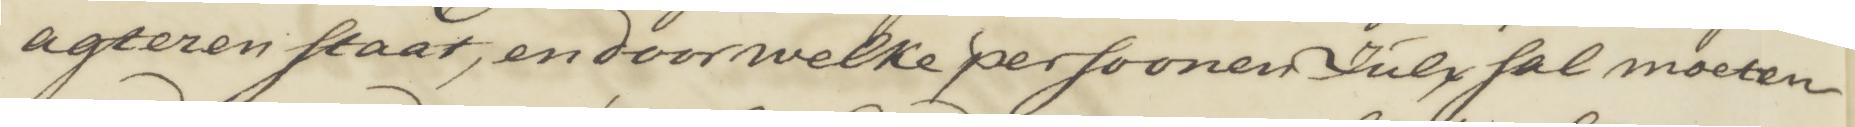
agteren staat, en door welke persoonen zulx sal moeten
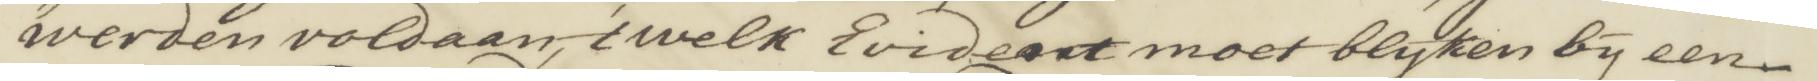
werden voldaan, ’t welk Evident moet blijken bij een
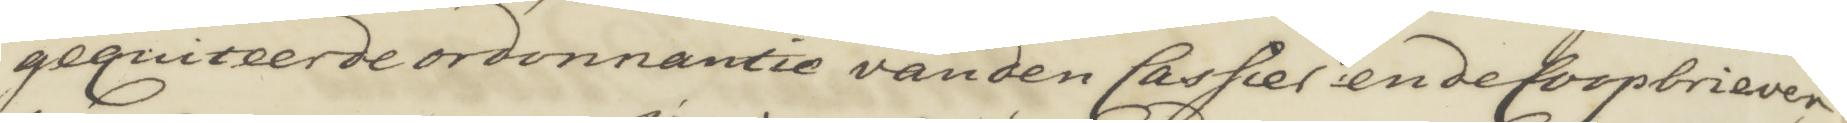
gequiteerde ordonnantie van den Cassier en de Coopbrieven
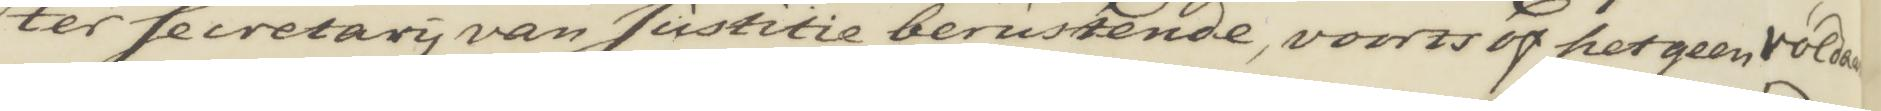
ter secretarij van Justitie berustende, voorts of hetgeen voldae
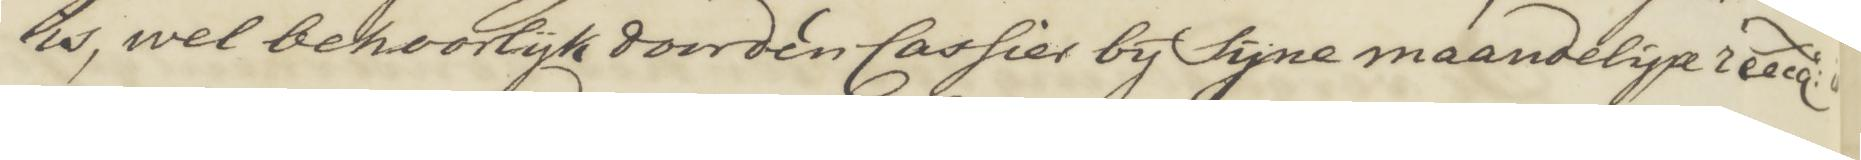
is, wel behoorlijk door den Cassier bij sijne maandelijxe reecq:„
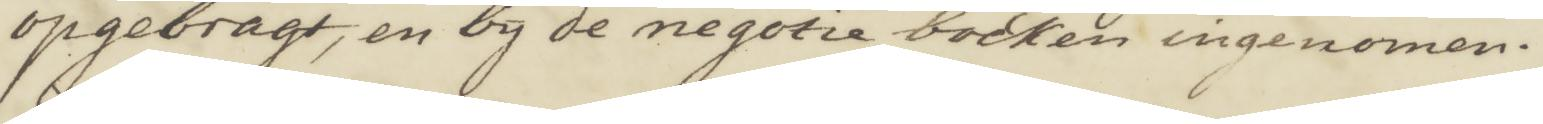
opgebragt, en bij de negotie boeken ingenomen.
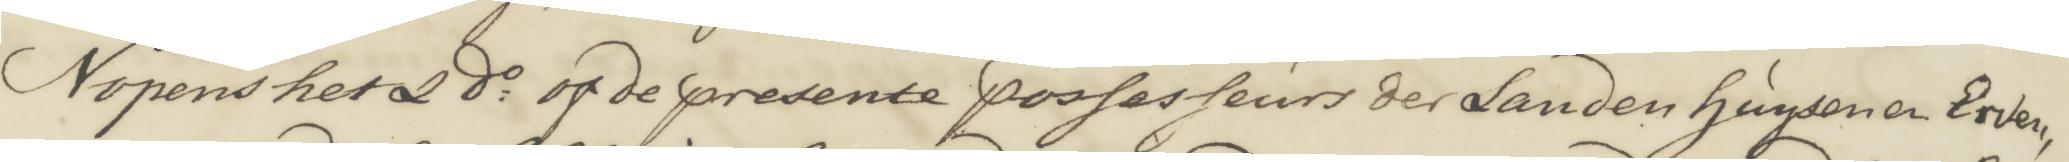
Nopens het 2 d:o of de presente possesseurs der Landen huijsen en Erven,
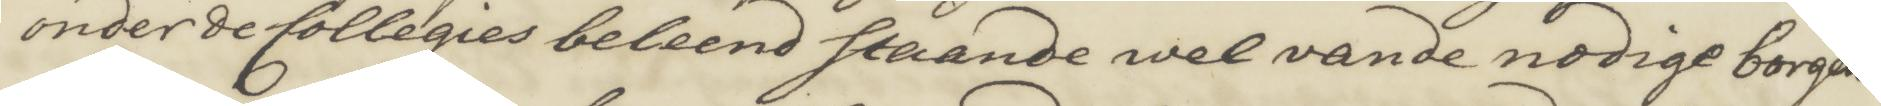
onder de Collegies beleend staande wel van de nodige borgen
